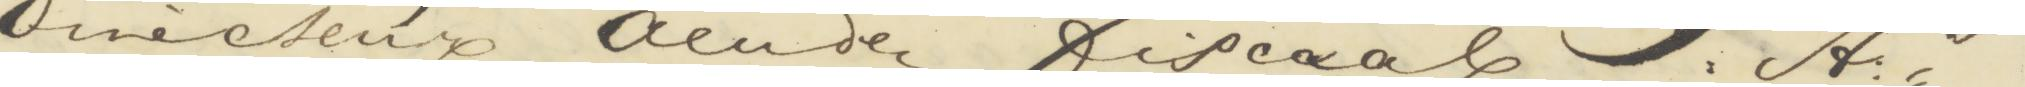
directeur aen den fiscaal J:s A:„s
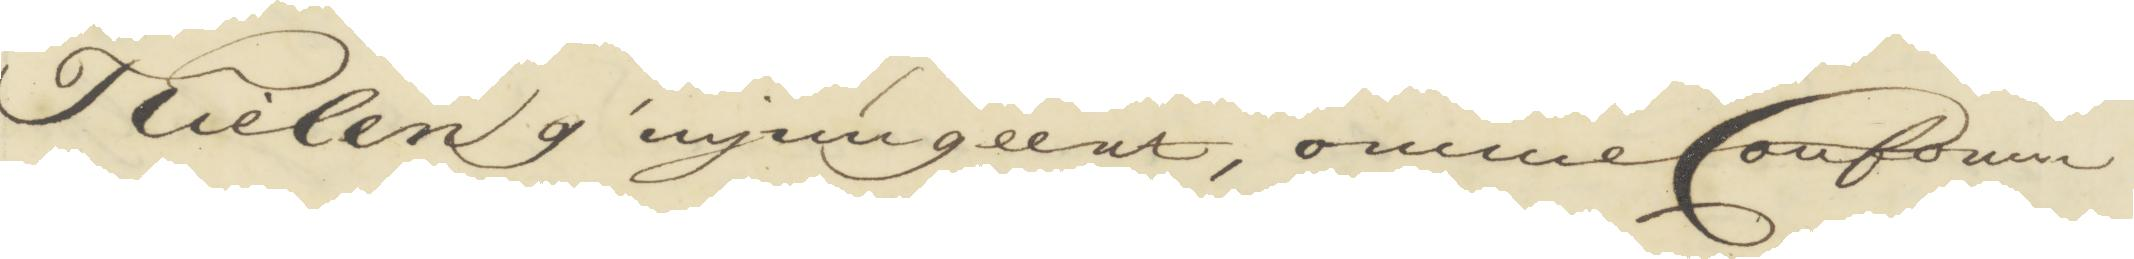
Thielen g’injuugeert, omme conform
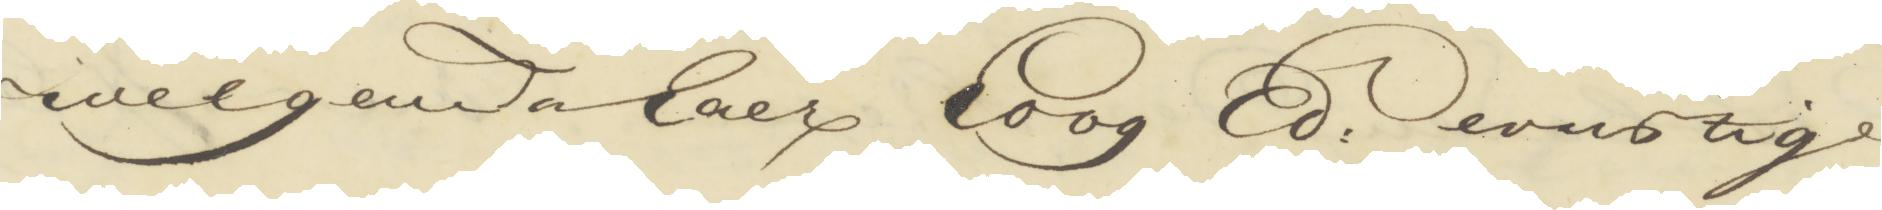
weegens haer hoog Ed: ernstige
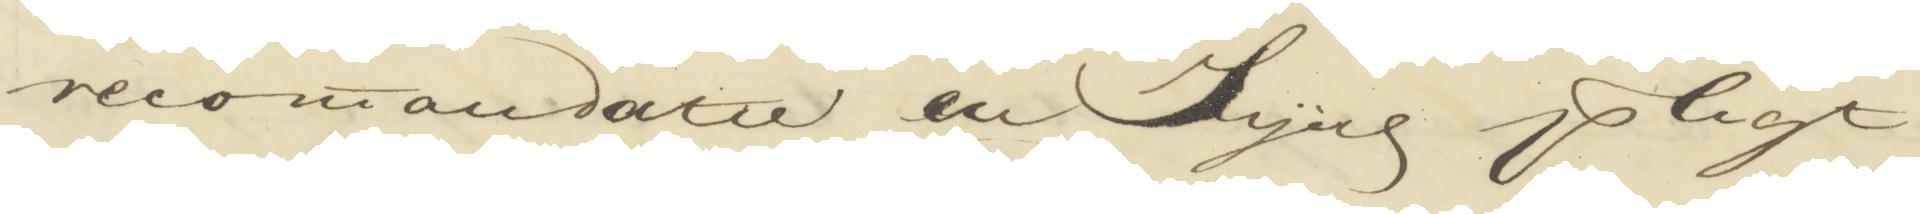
recomandatie en Sijnen pligt
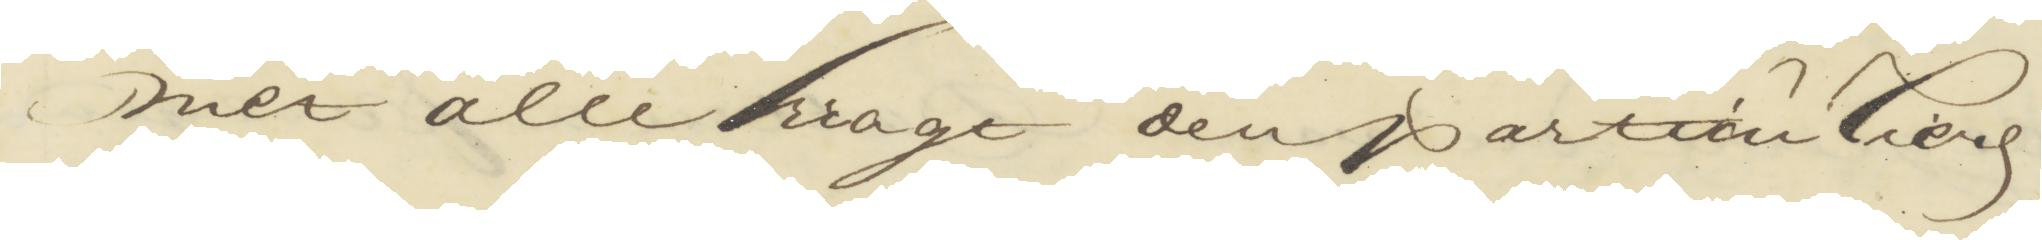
met alle kragt den particulieren
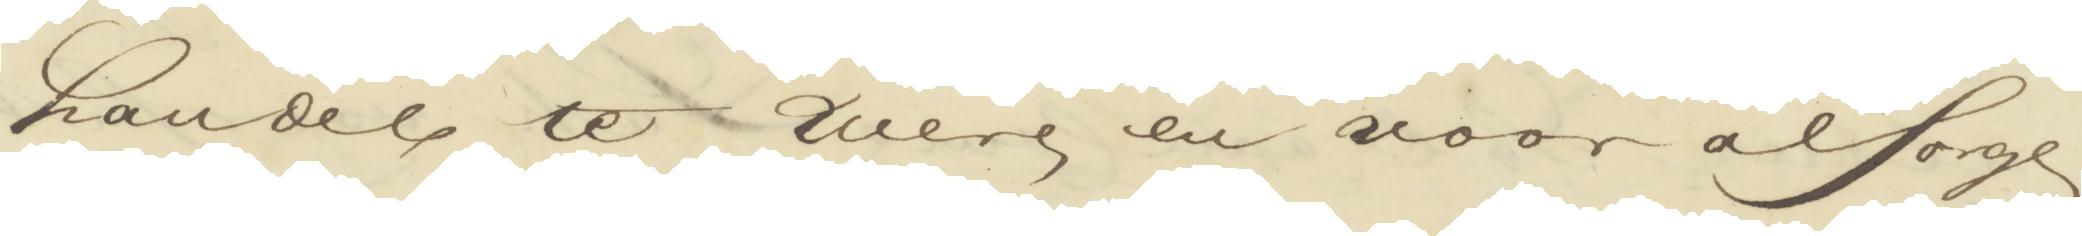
handel te weren en voor al sorgen
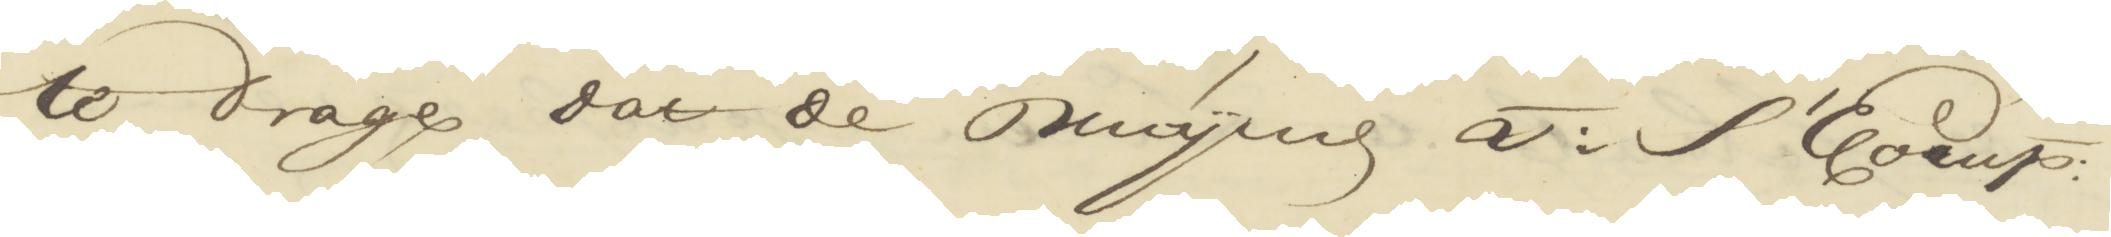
te drage dat de druijmen v: s' Ecomp:
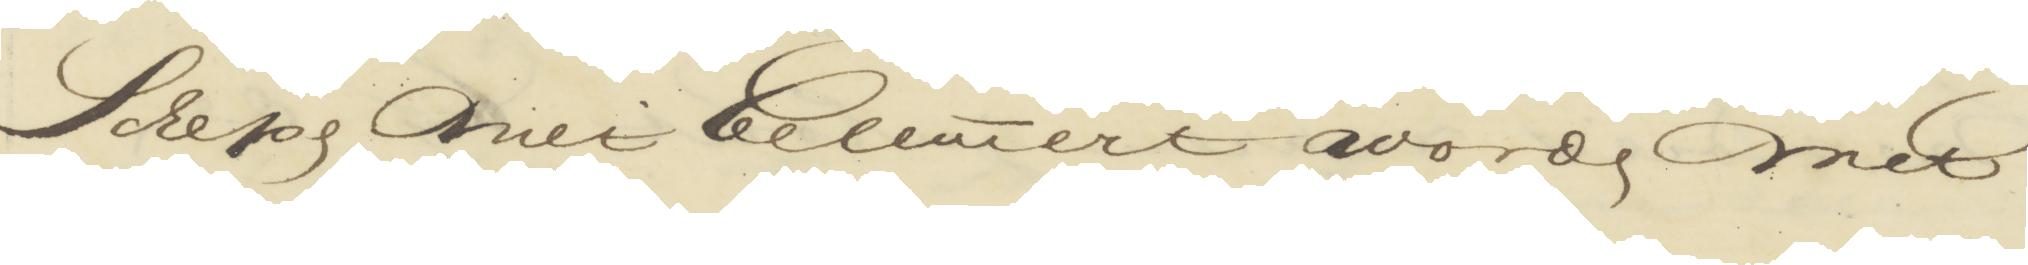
schepen niet belemert worden met
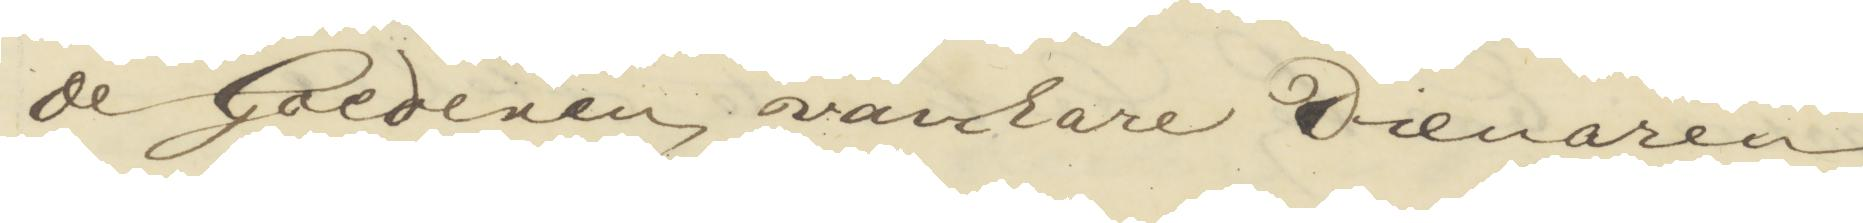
de Goederen van hare dienaren
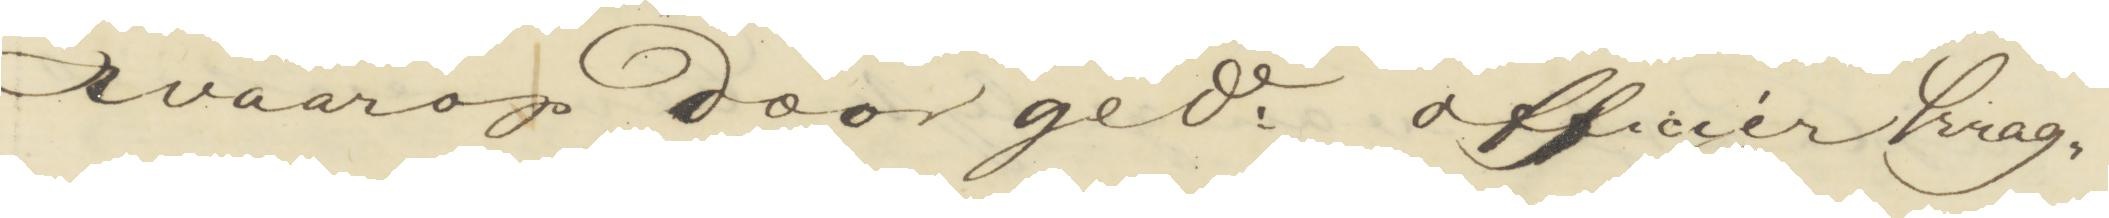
waarop door ged:e officier krag„
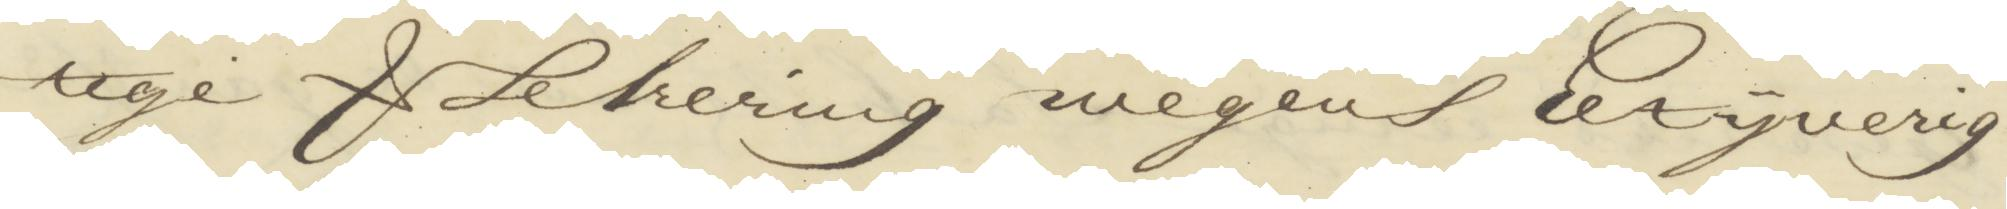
tige versekering wegens het ijverig
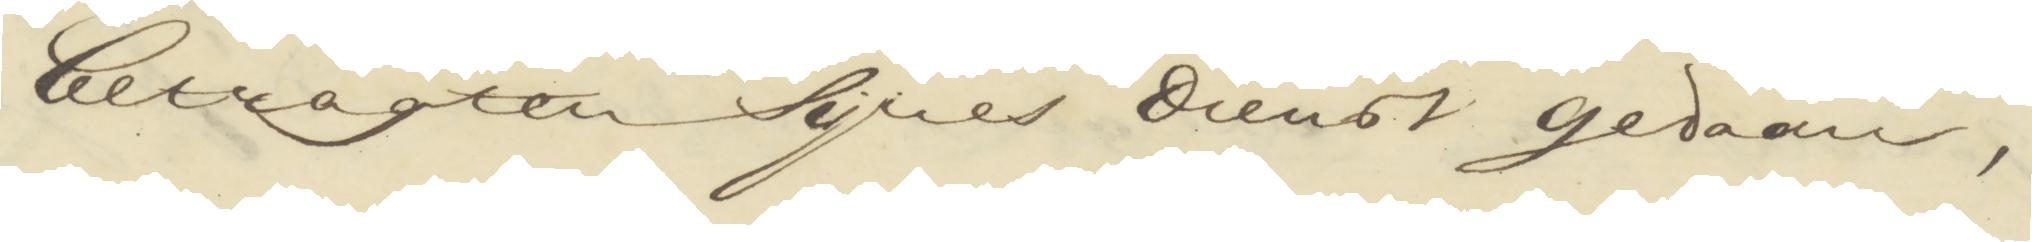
betragten sijnes dienst gedaan,
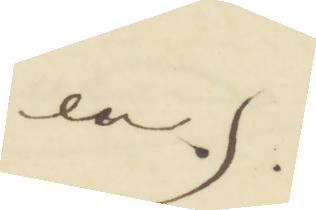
en./.
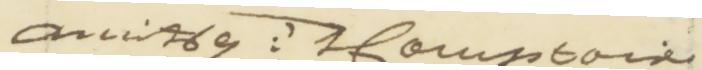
mitsg: 't Comptoire
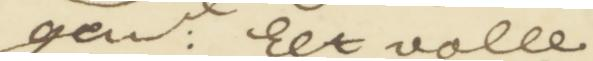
gen:e het volle
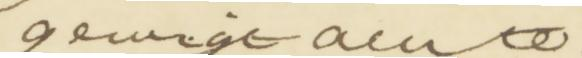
gewigt aen te
